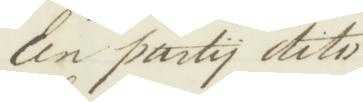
Een partij dito
